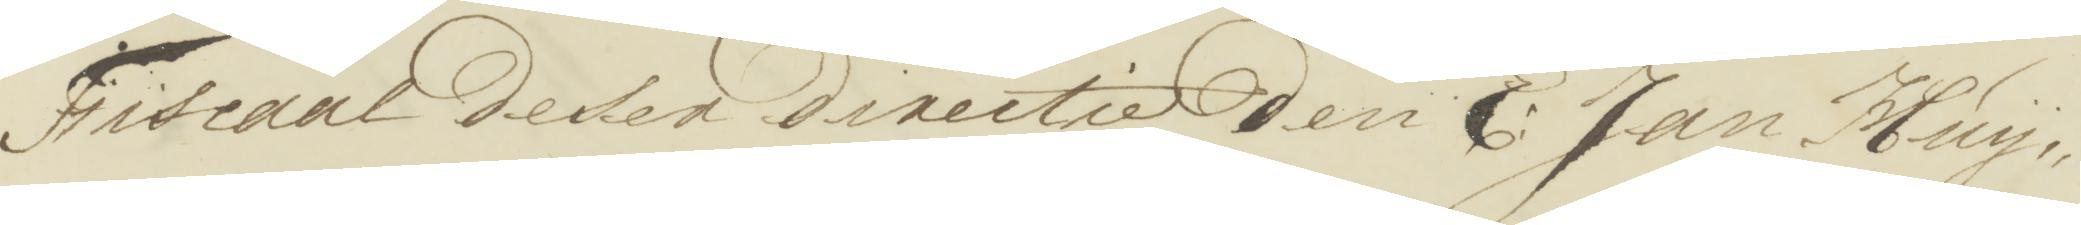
Fiscaal deser directie den E: Jan Huij„
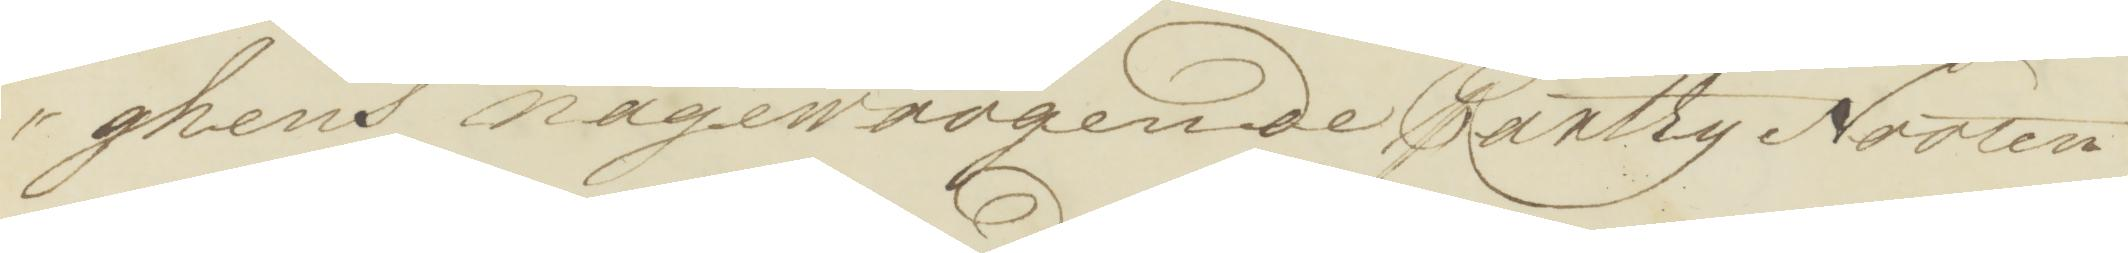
„ghens nagewoogende parthy Nooten
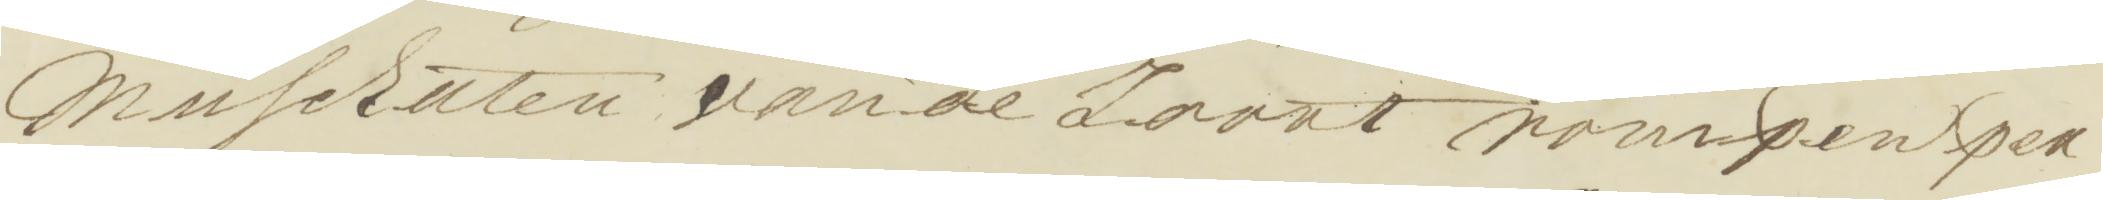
muschaten van de zoort rompen per
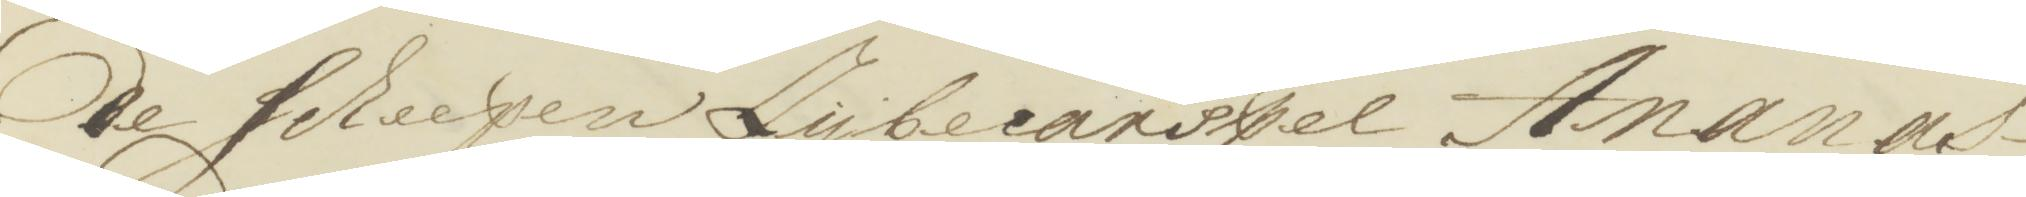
de scheepen Zijbecarspel Ananas
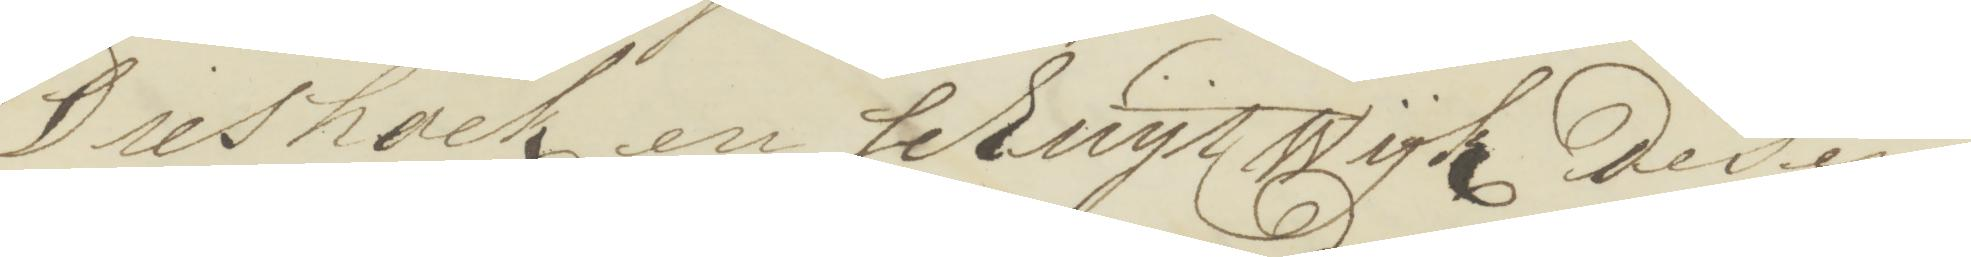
Dieshoek en schuijtwijk desen
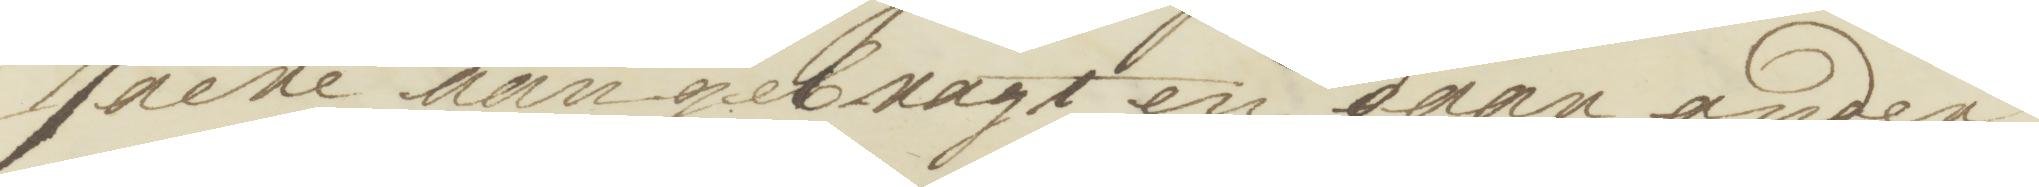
Jaere aangebragt en daar onder
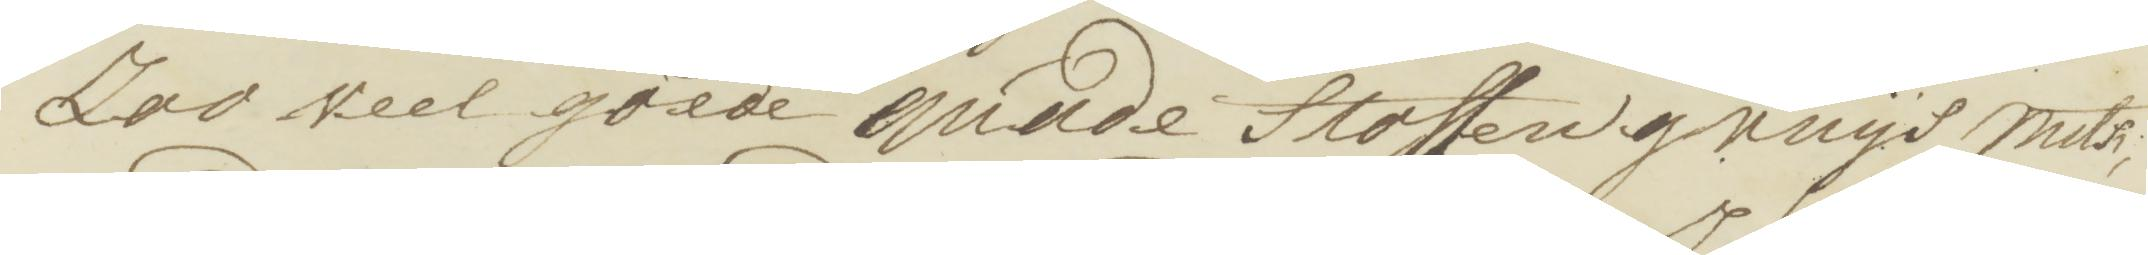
zoo veel goede quade stoffen gruijs mits;
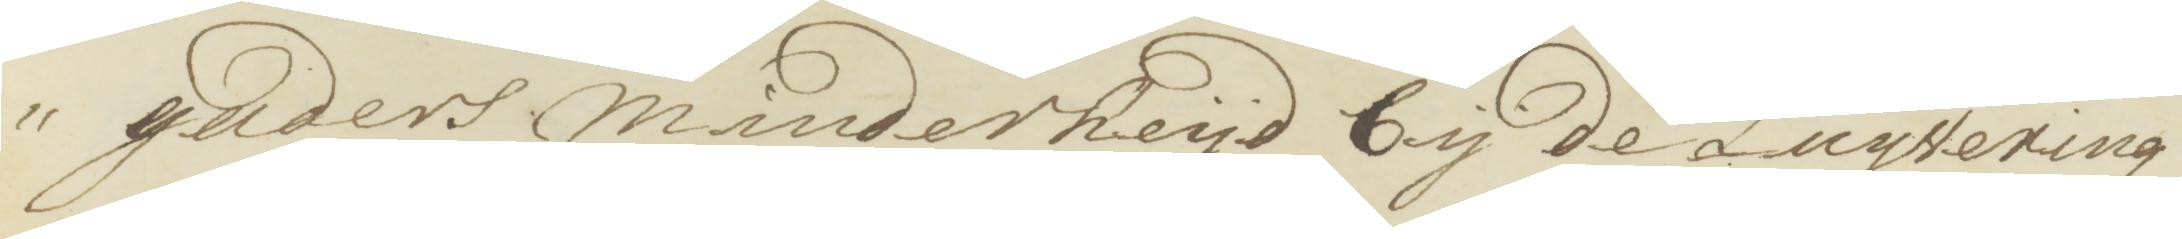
„gaders minderheijd bij de zuyvering
